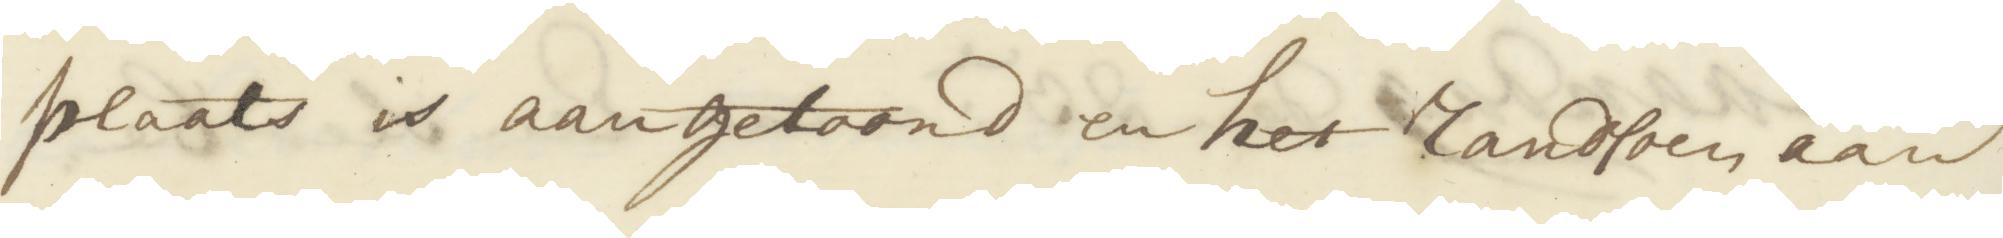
plaats is aangetoond en het randsoen aan
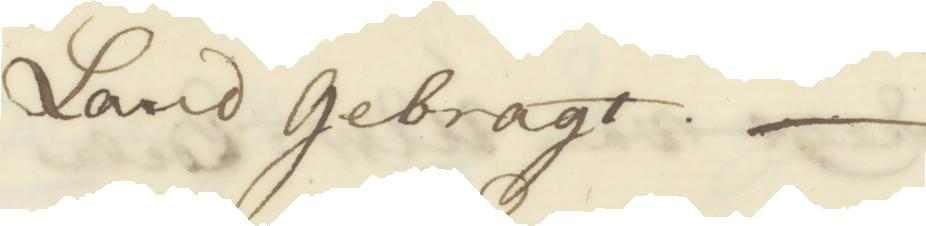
Land gebragt. —
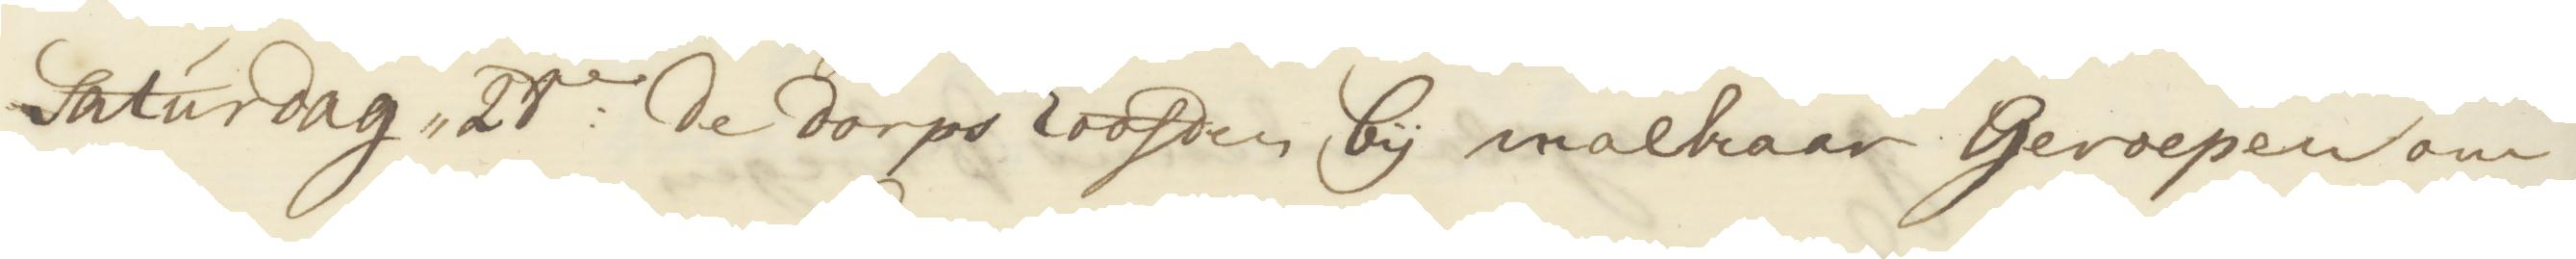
Saturdag „ 28:e de dorps hoofden bij malkaar geroepen om
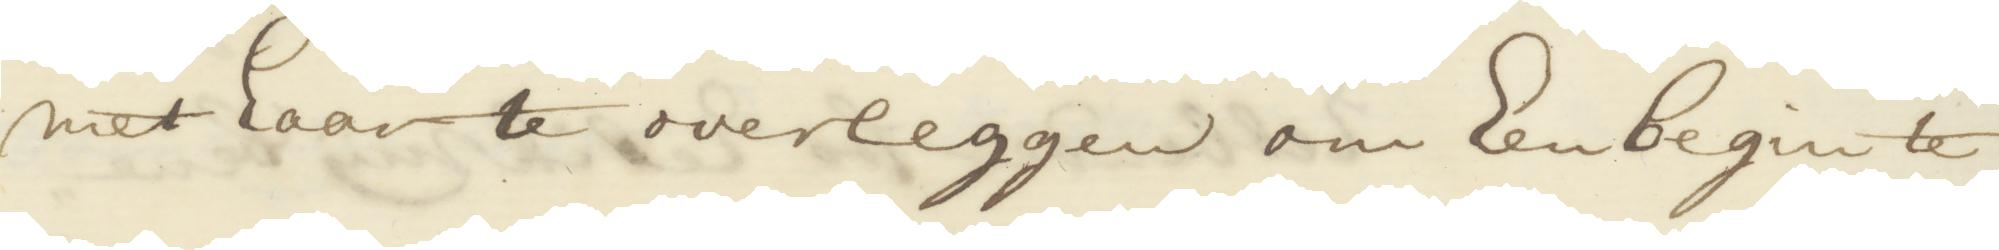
met haar te overleggen om Een begin te
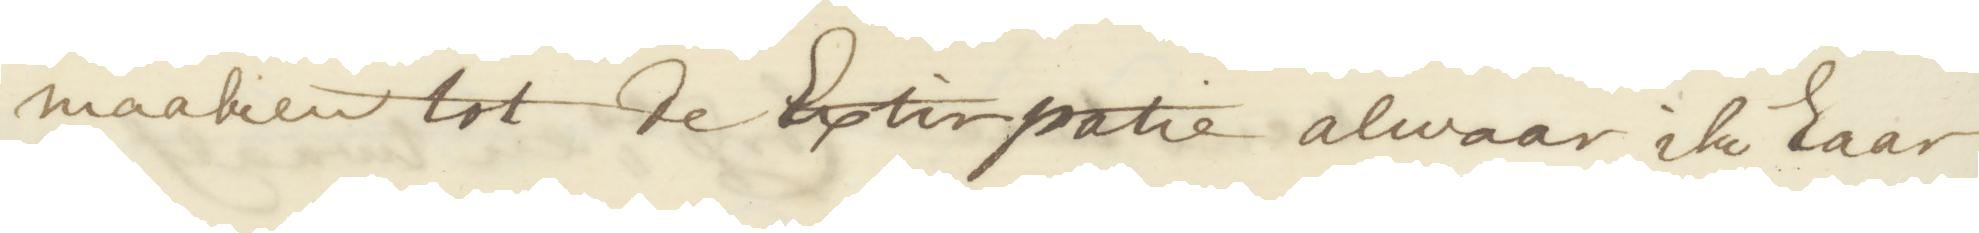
maaken tot de Extirpatie alwaar ik haar
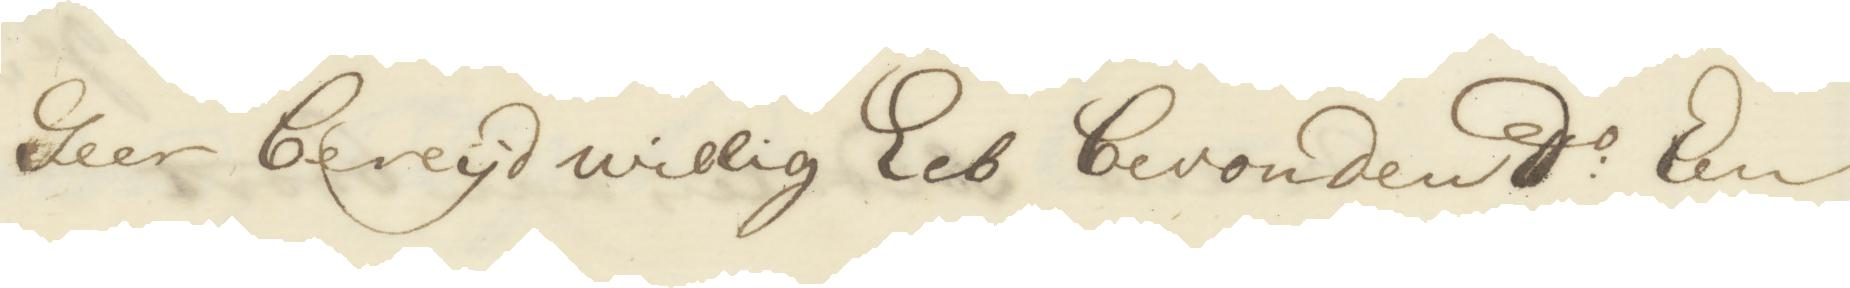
seer bereijd willig heb bevonden d:o Een
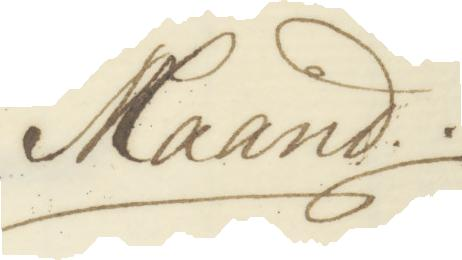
Maand.
